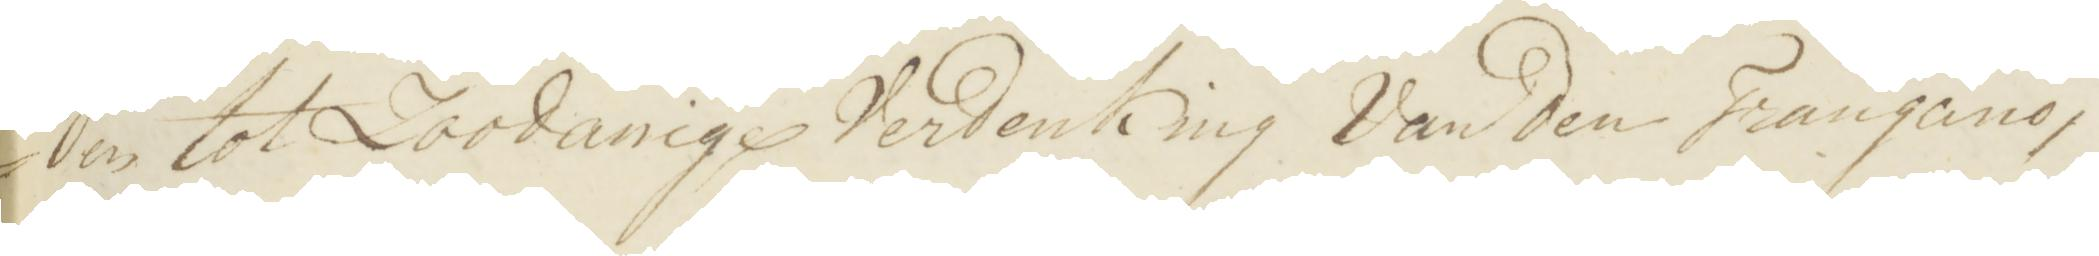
den tot zoodanige Verdenking van den Frangano,
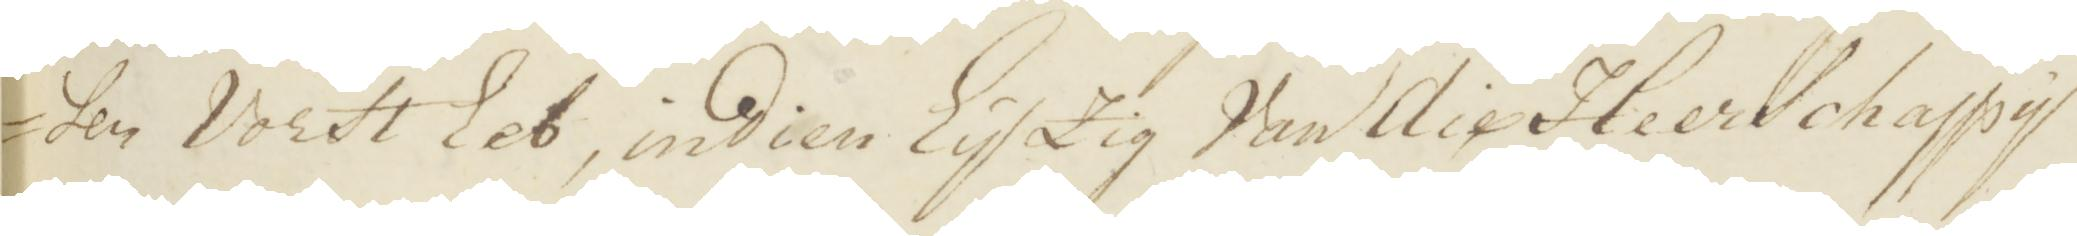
„len vorst heb, indien hij zig van die Heerschappij
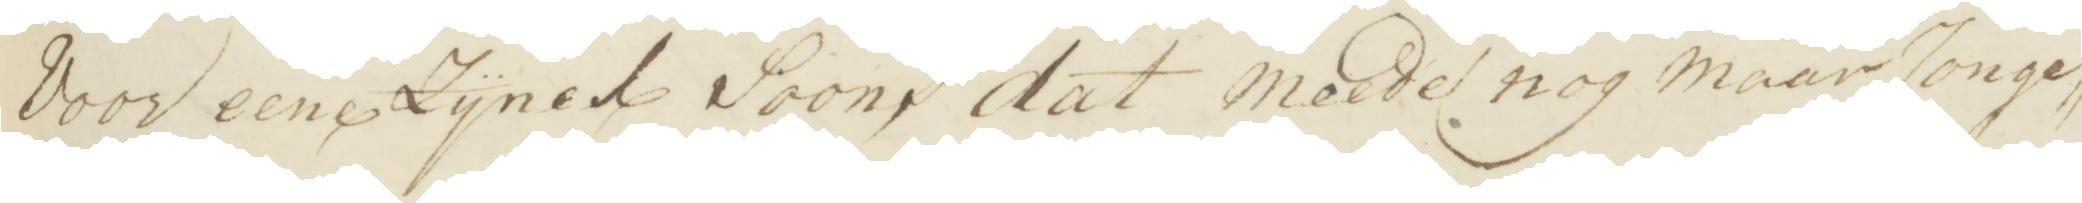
voor eene zijnes soons dat meede nog maar Jonge
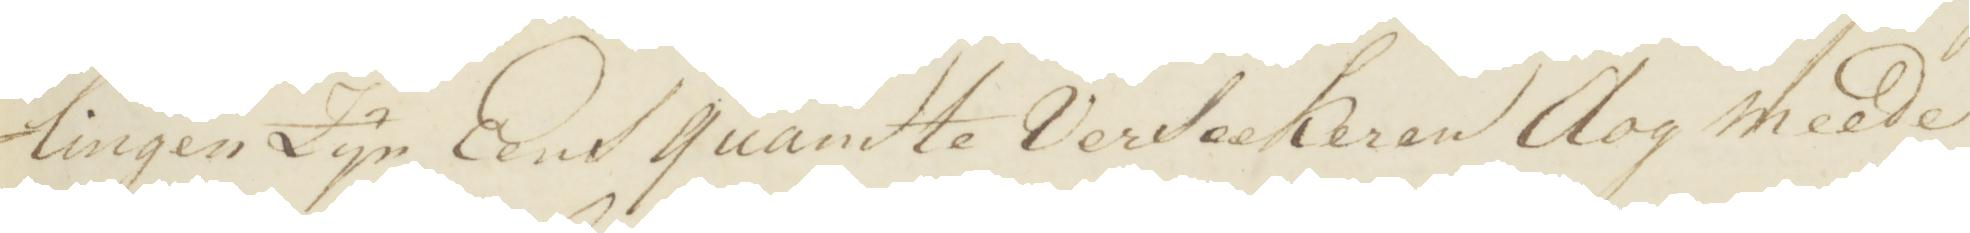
„lingen Zijn Eens quamste verseekeren dog meede
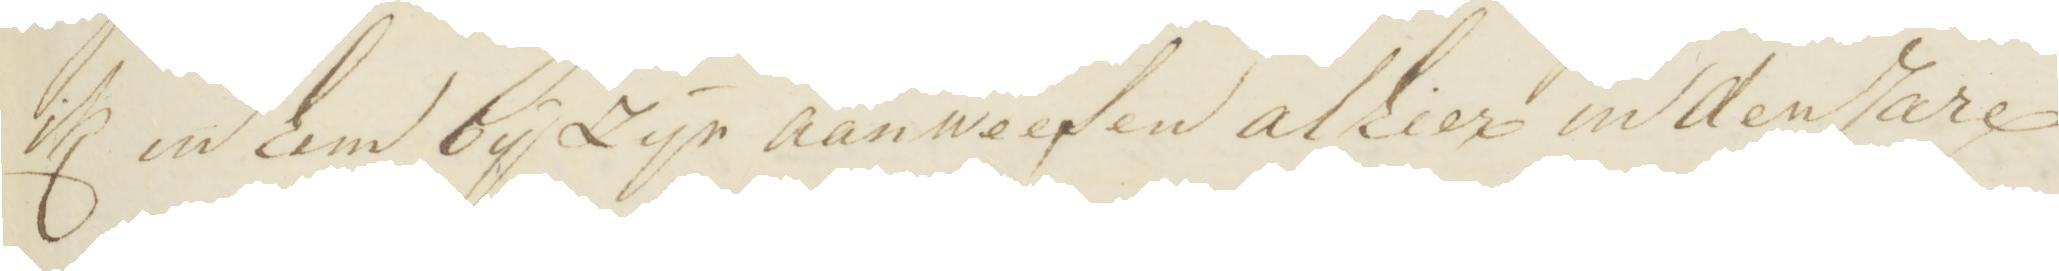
ik en hem bij zijn aanweesen alhier in den Jare
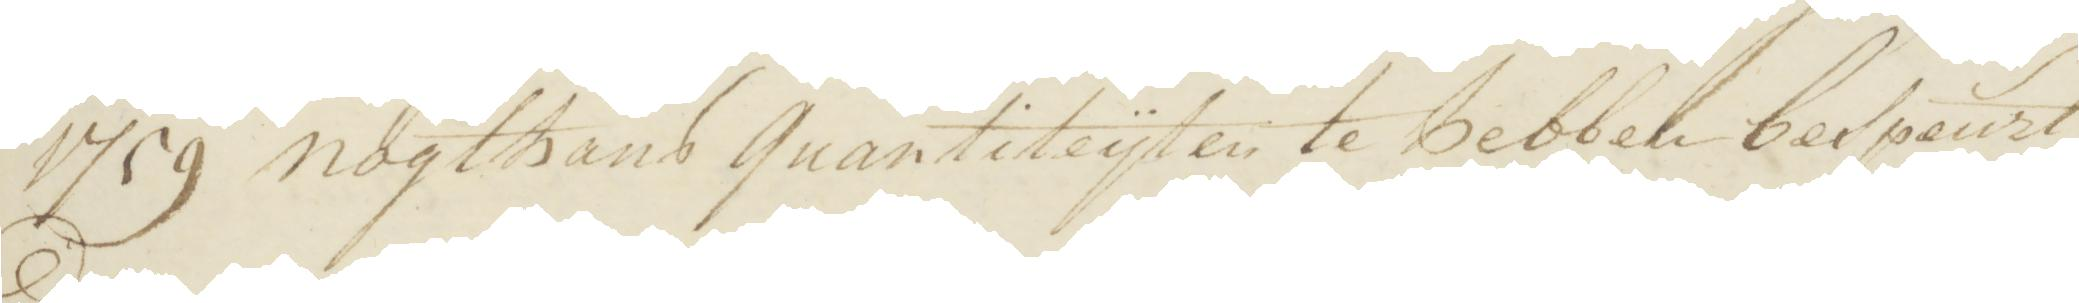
1759 nogthans quantiteijten te hebben bespeurt,
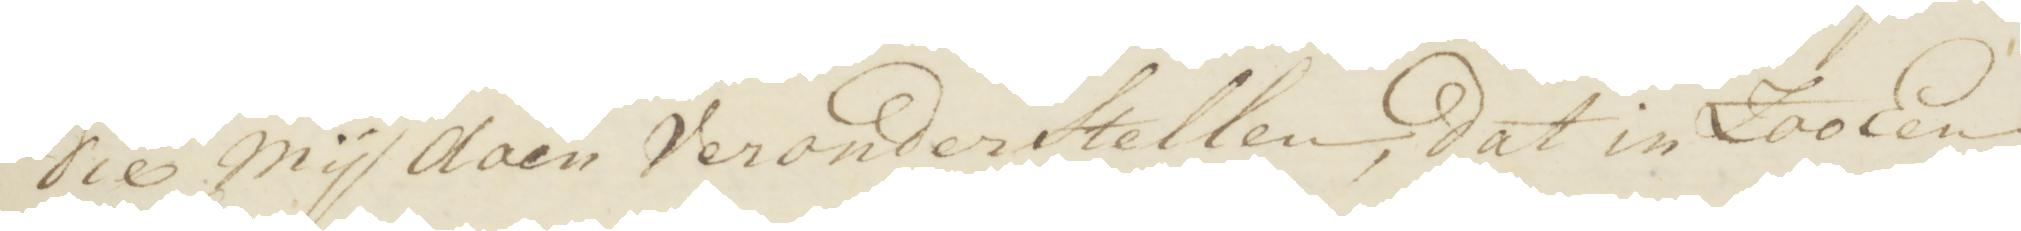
die mij doen veronderstellen, dat in Zoo Een
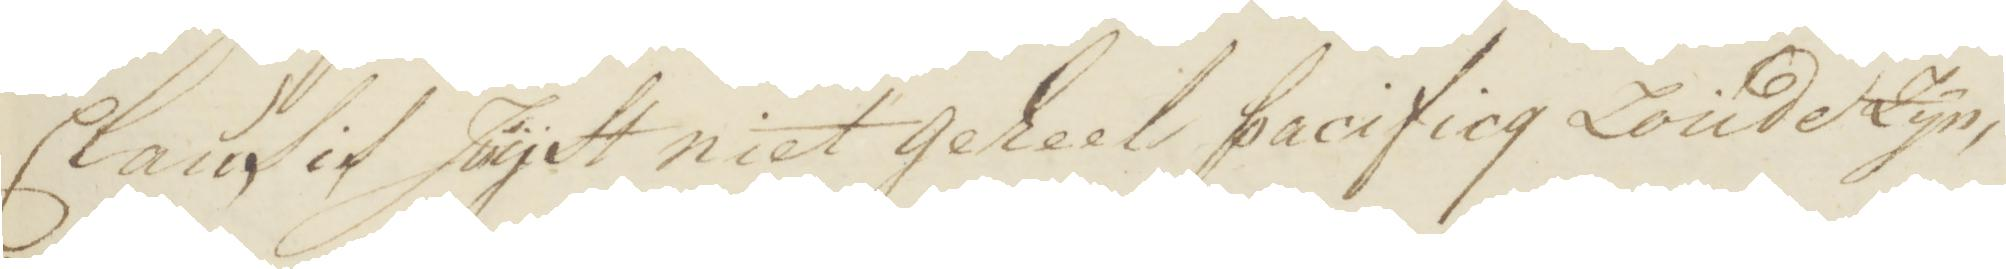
Clausis Juijst niet geheel pacificq zoude zijn,
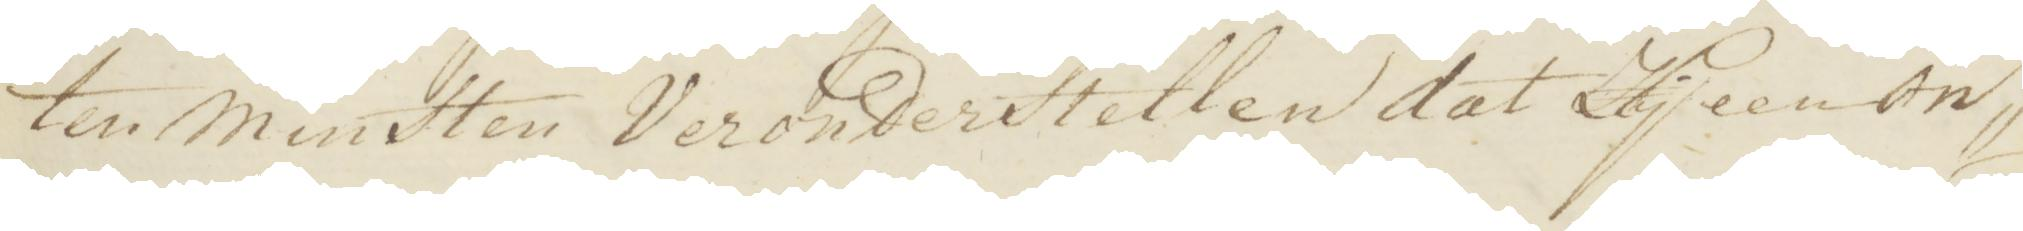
ten minsten Veronderstellen dat Hij een on„
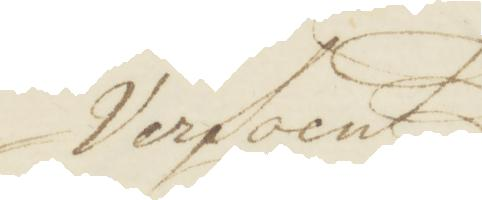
„versoen
